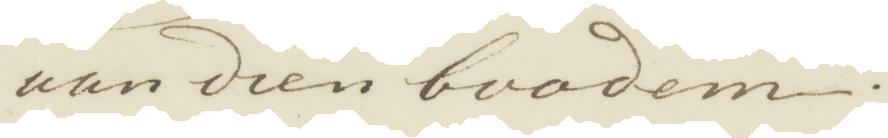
aan dien boodem.
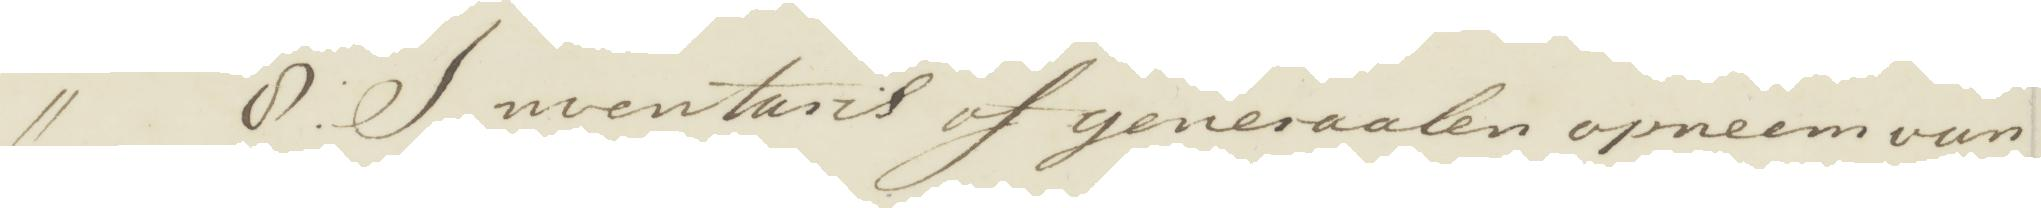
„ 8: Inventaris of generaalen opneem van
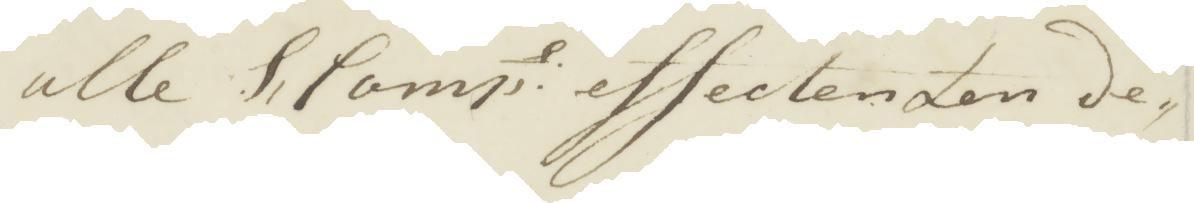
alle s,Comp:s effecten ten de„
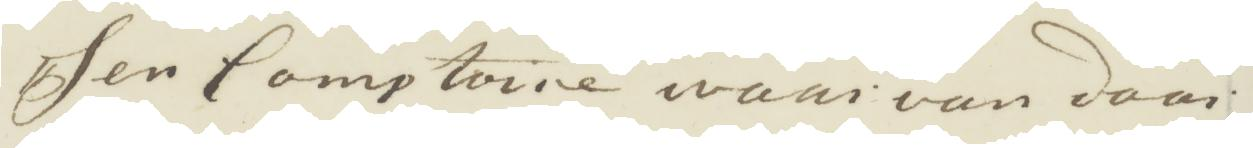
sen Comptoire waar van door
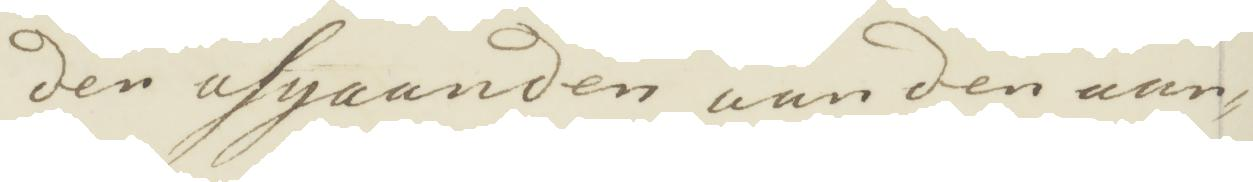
der afgaanden aan den aan„
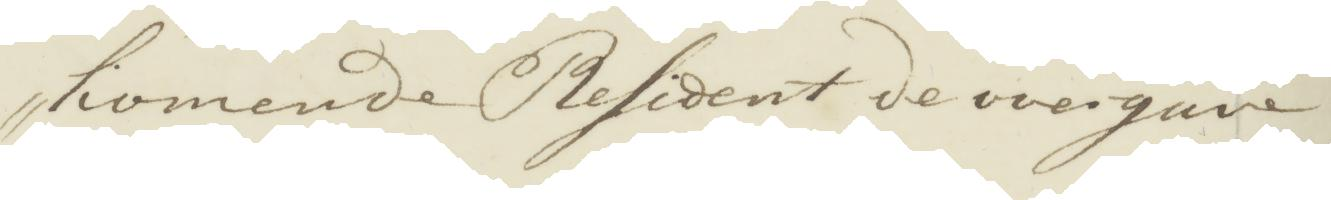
„komende Resident de overgave
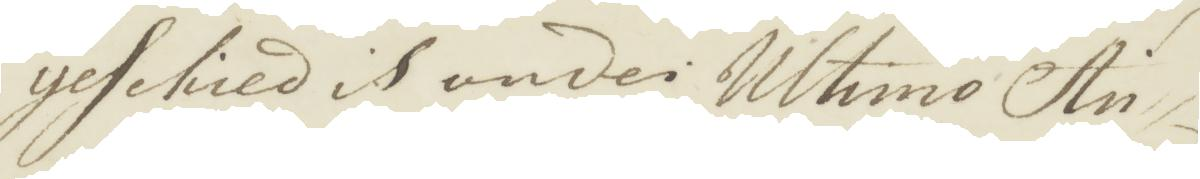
geschied is onder Ultimo Au„
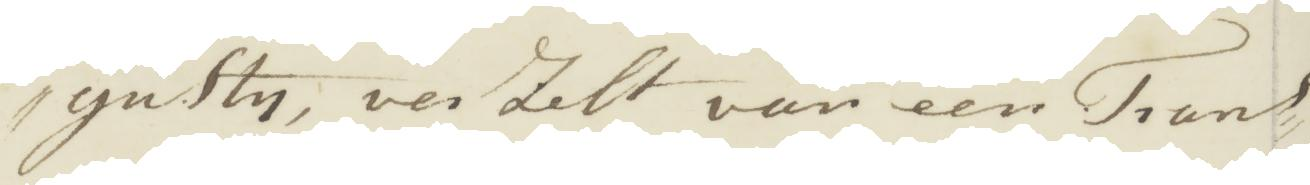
„gustij, verzelt van een Trans„
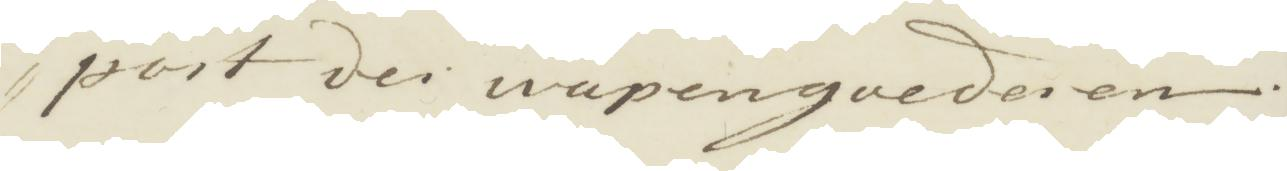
„post der wapengoederen
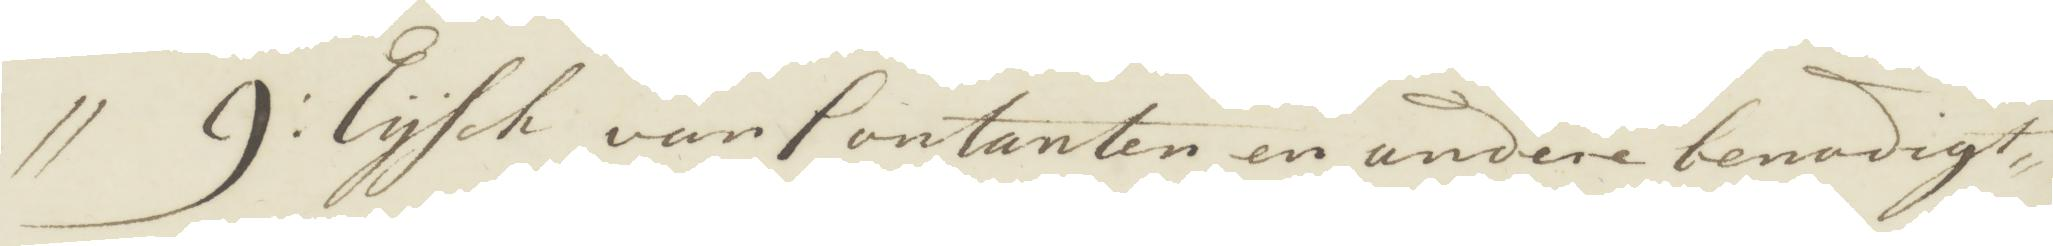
„ 9: Eijsch van Contanten en andere benodigt„
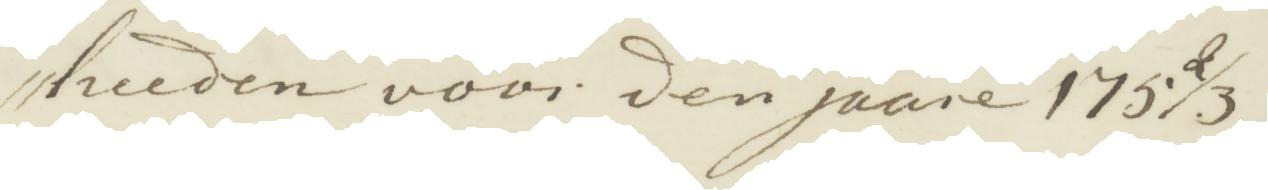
„heeden voor den jaare 1752/3
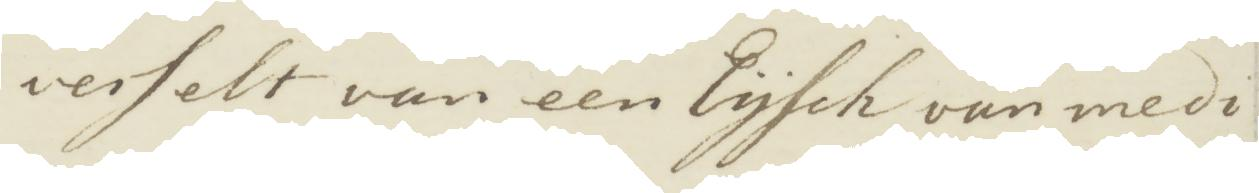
verselt van een Eijsch van medi
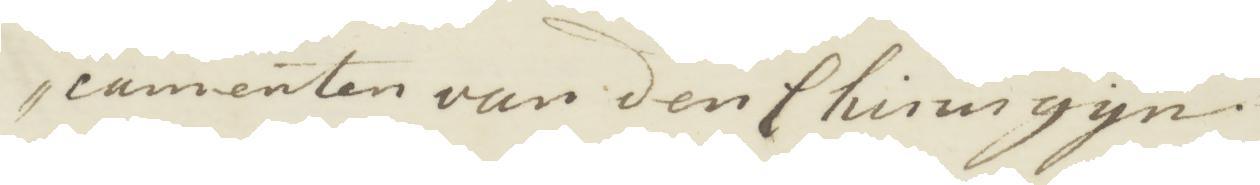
„camenten van den Chirurgijn
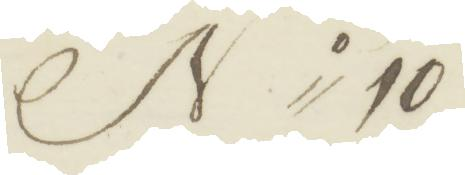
N„o 10
